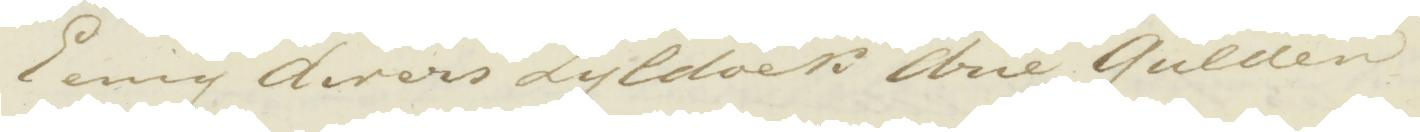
Eenig divers Zyldoek drie Gulden
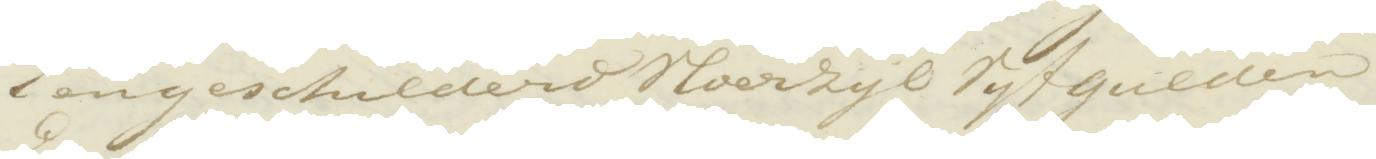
Een geschilderd Vloerzyl Vyf gulden
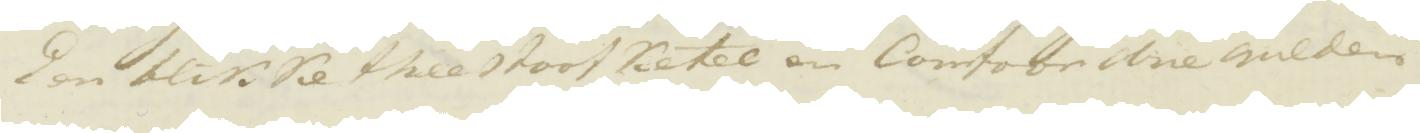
Een blikke theestoof ketel en Comfoor drie gulden
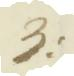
3..
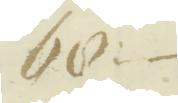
68:—
